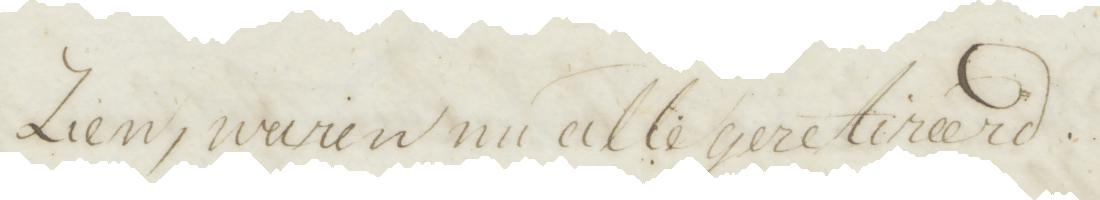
zien, waren nu alle geretireerd.
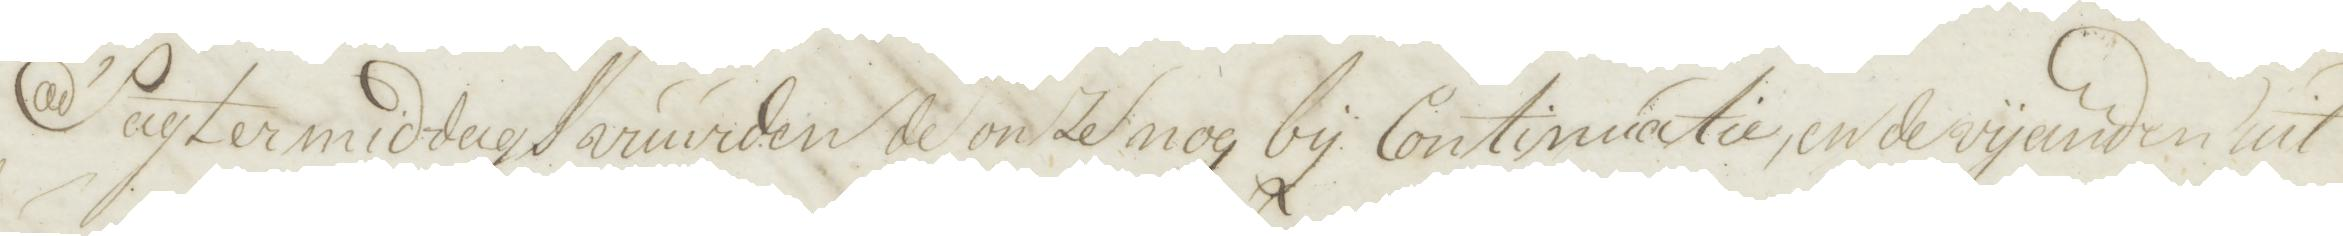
'S agter middags vuurden de onze nog bij Continuatie, en de vijanden uit
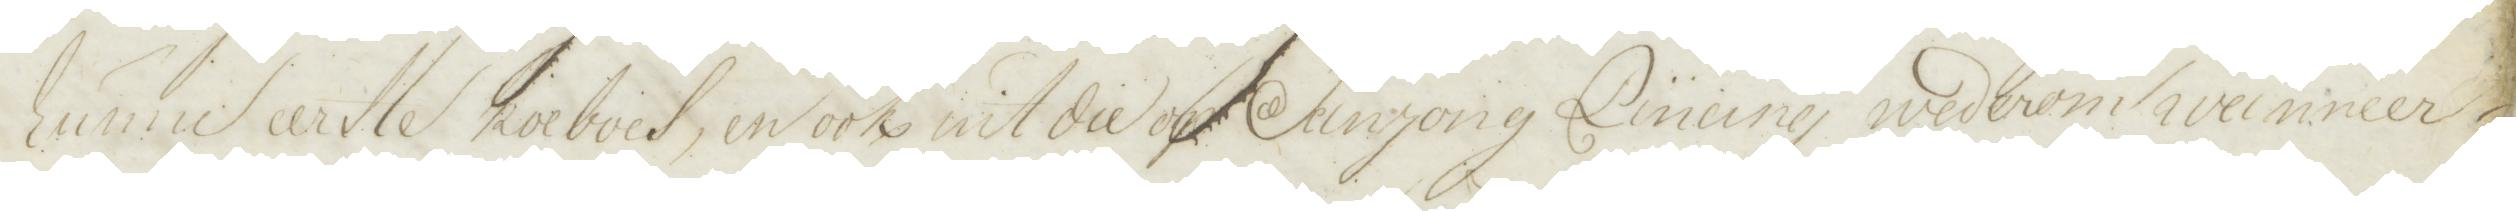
hunne eerste koeboes, en ook uit die op Tangong Pinang, wederom wanneer
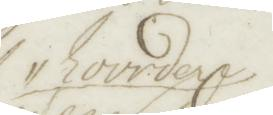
„hoorden
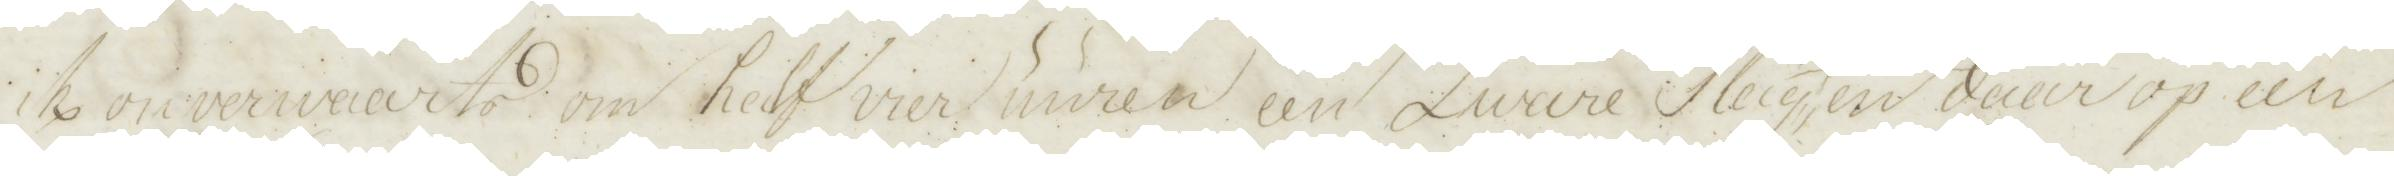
ik onverwaarts om helf vier uuren een zware Sleig„ en daar op een
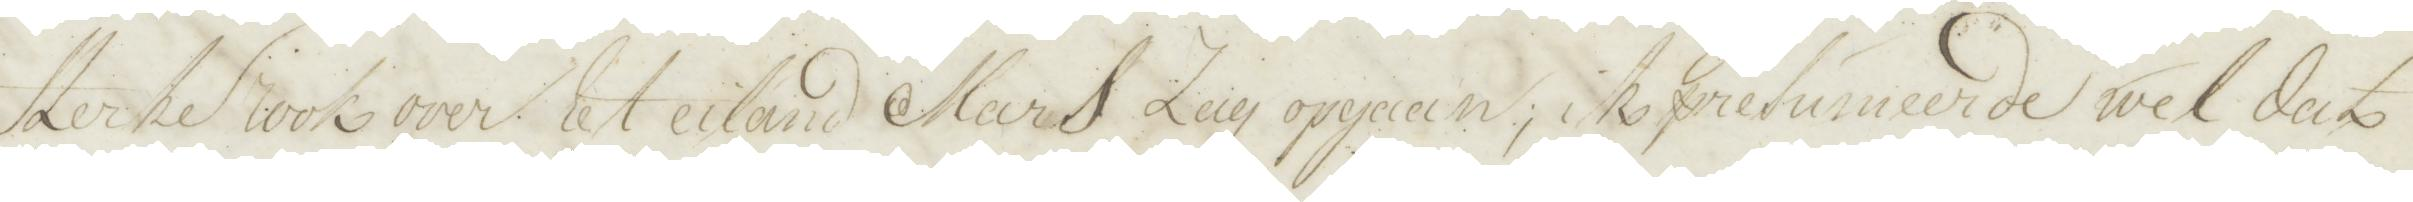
sterke rook over het eiland Mars zag opgaan; ik presumeerde wel dat
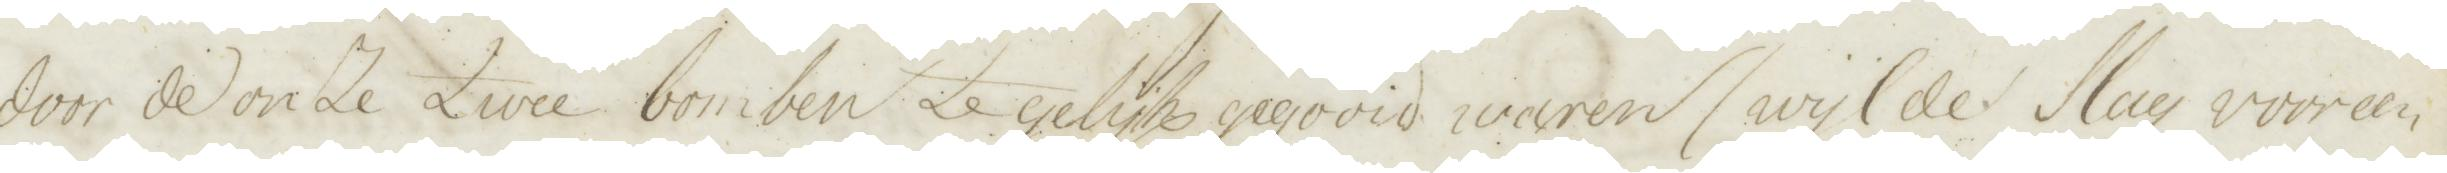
door de onze twee bomben te gelijk gegooid waren (wijlde slag voor een
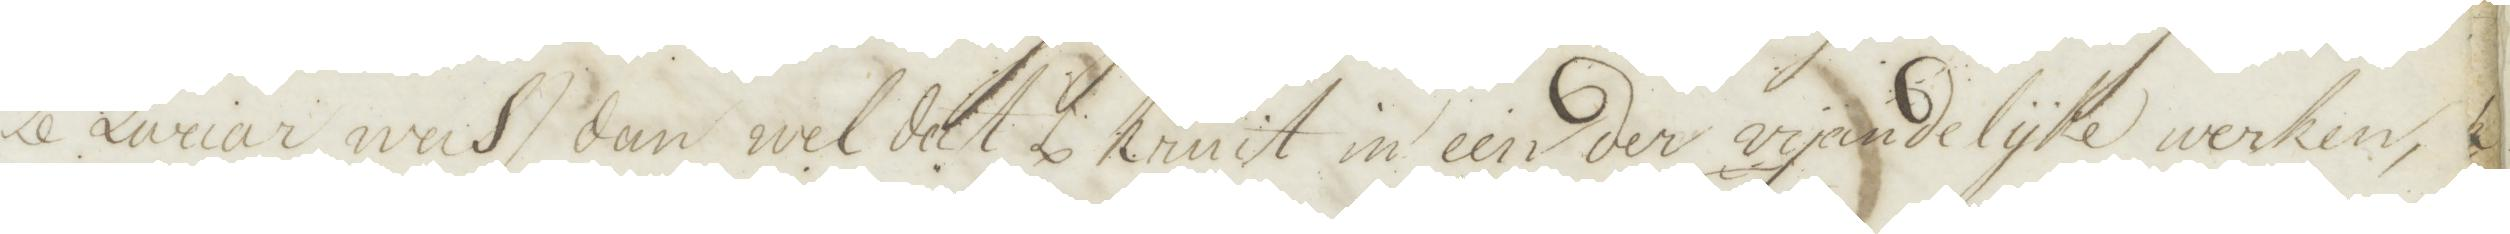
te Zwaar was/ dan wel dat 't kruit in een der vijandelijk werken,
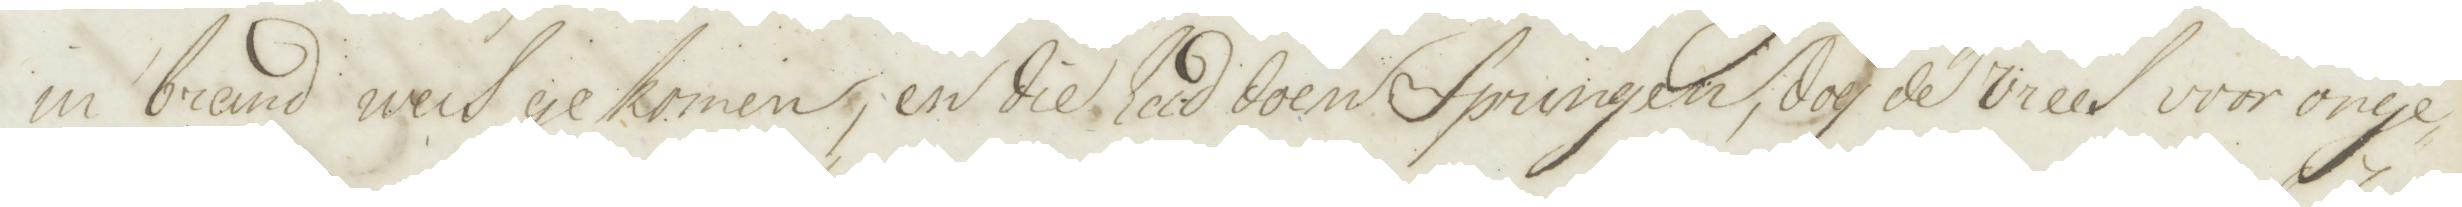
in brand was gekomen, en die had doen springen, dog de vrees voor onge„
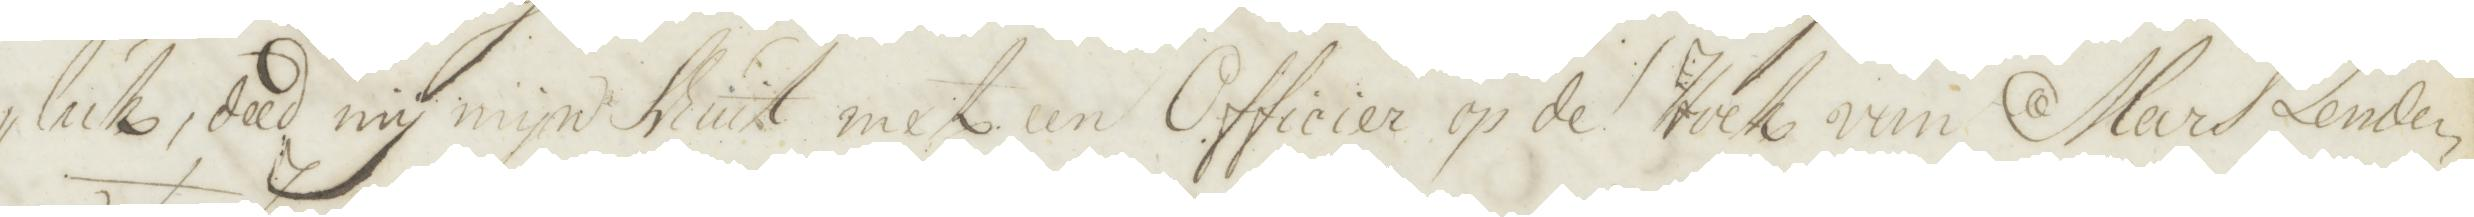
luk, deed mij mijn schuit met een Officier op de Hoek van Mars zenden
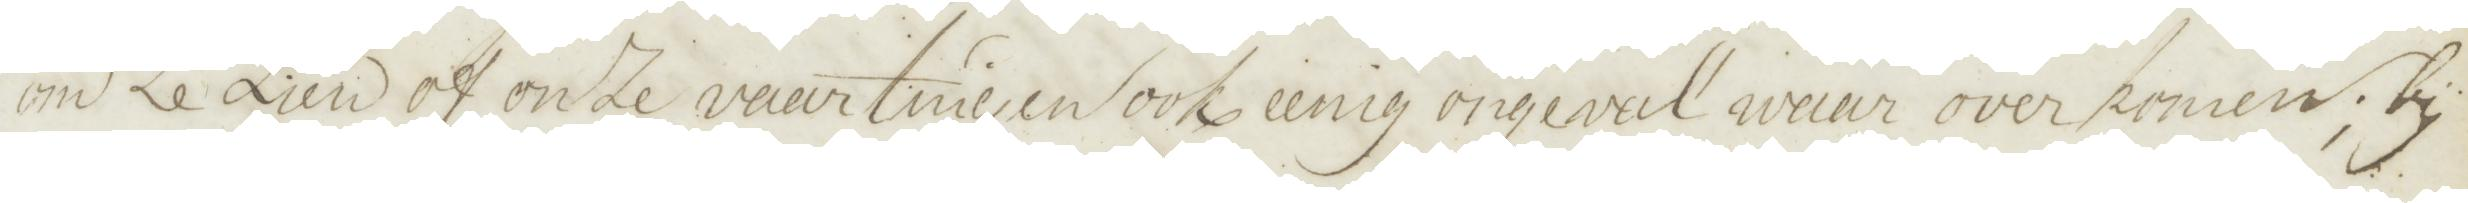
om te zien of onze vaartuigen ook eenig ongeval waar overkomen; bij
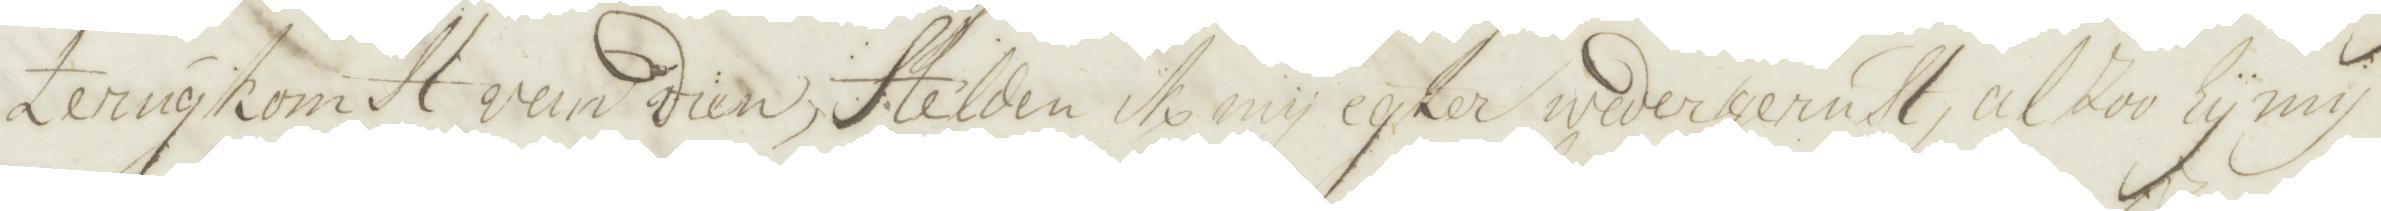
terugkomst van dien, stelden ik mij egter weder gerust, alzoo hij mij
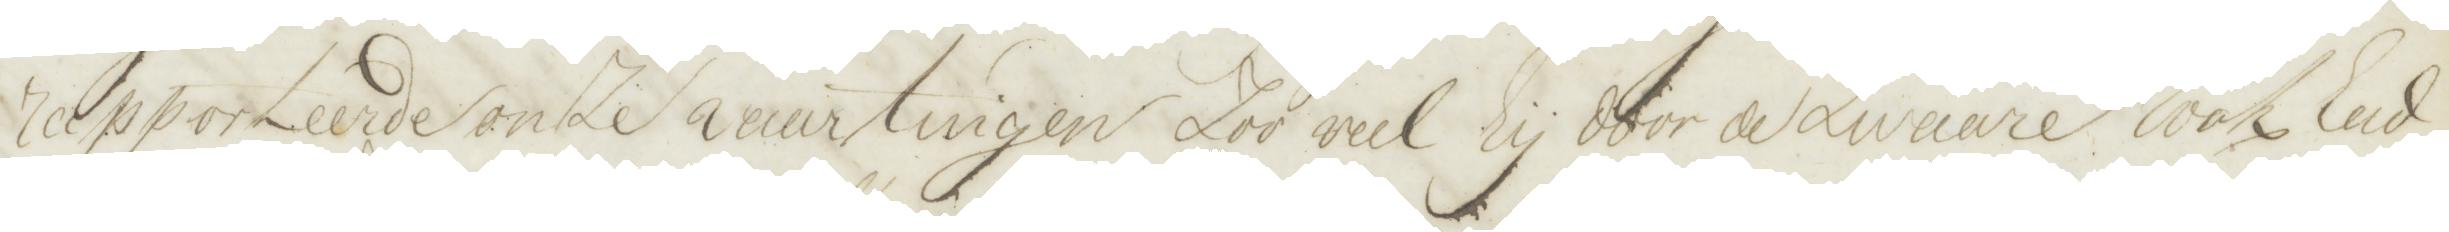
rapport Leerde onze vaartuigen zoo veel hij door de zwaare rook had
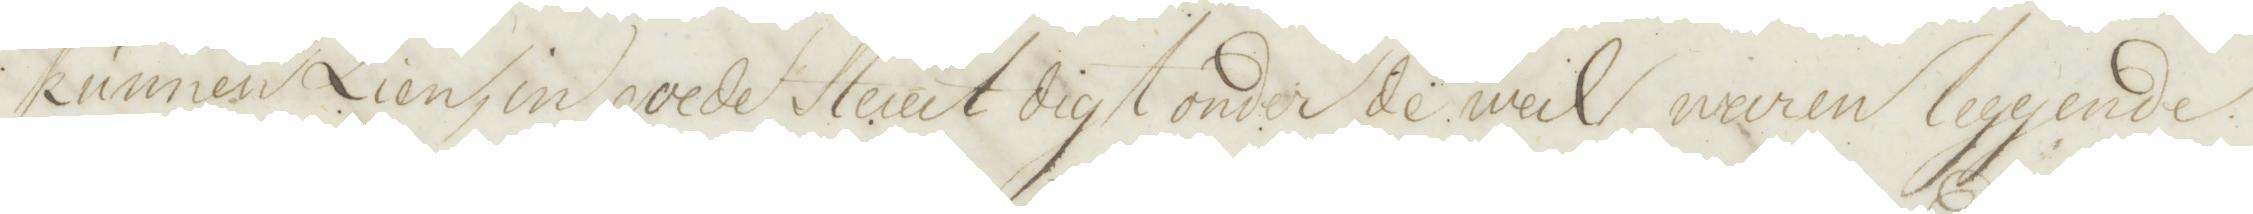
kunnen zien, in goede staat digt onder de wal waren leggende.
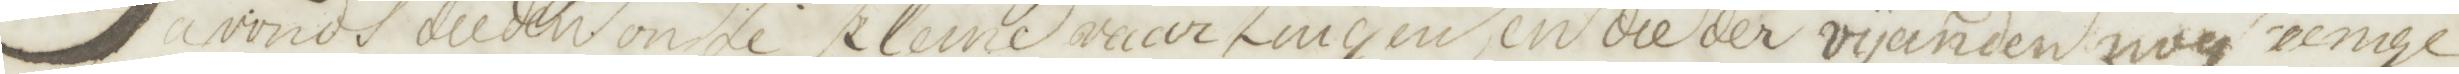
'Savonds deeden onze kleine vaartuigen en die der vijanden nog eenige
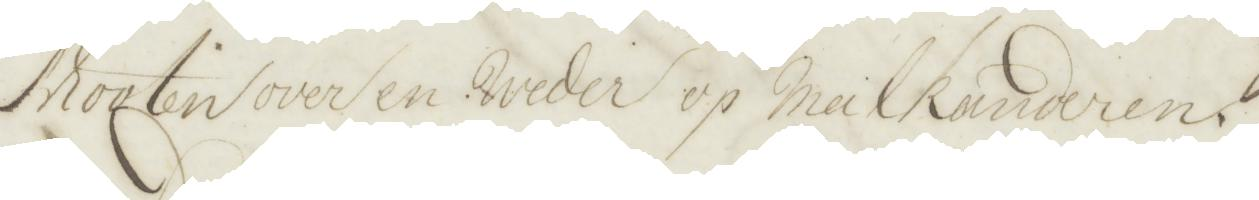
schooten over en weder op malkanderen.
